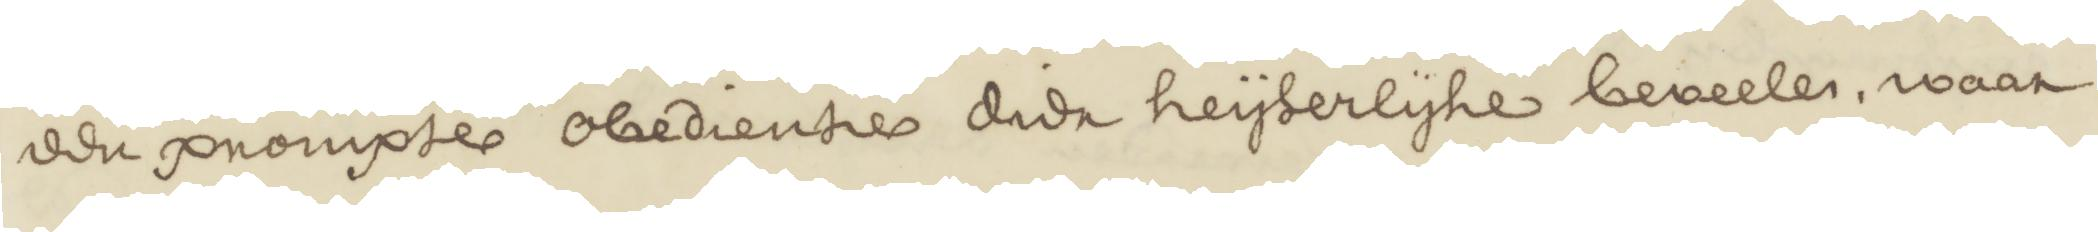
een prompte obedientie dier keijserlijke beveele, waar
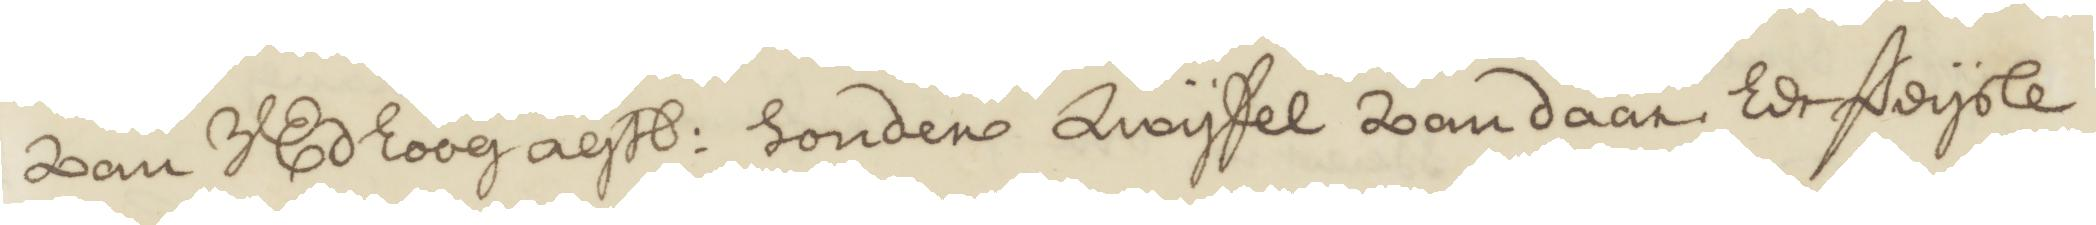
van VEdhoog agtb: sonder twijfel van daar het vereijste
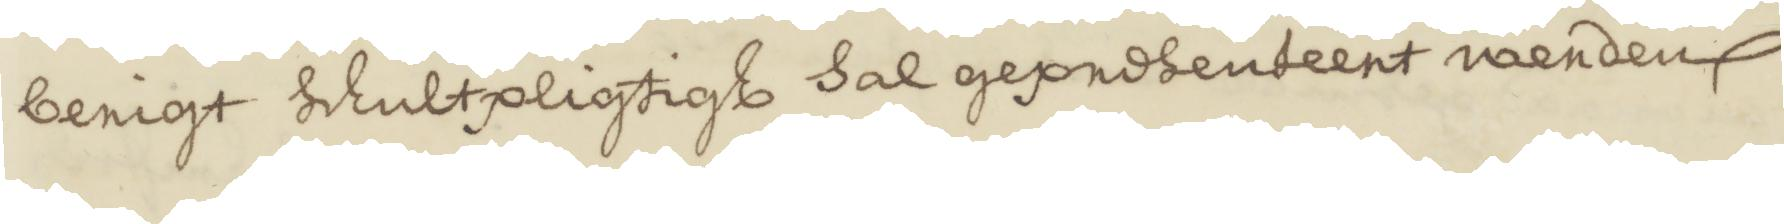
berigt schultpligtigh sal gepresenteert werden
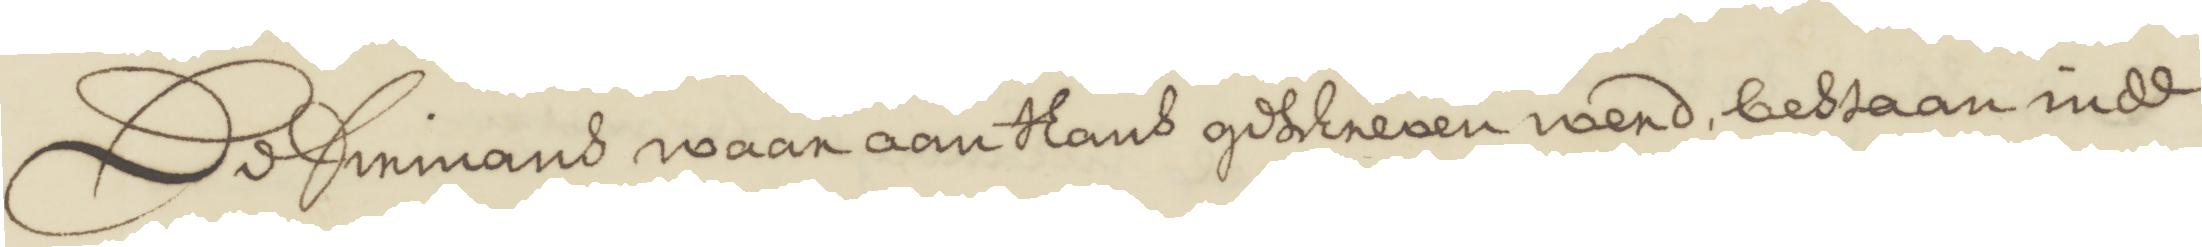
De firinans waar aan thans geschreven werd, bestaan inde
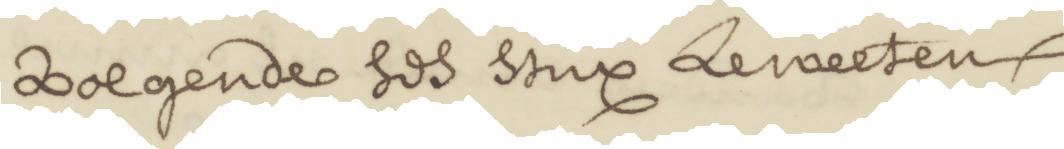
volgende ses stux teweeten
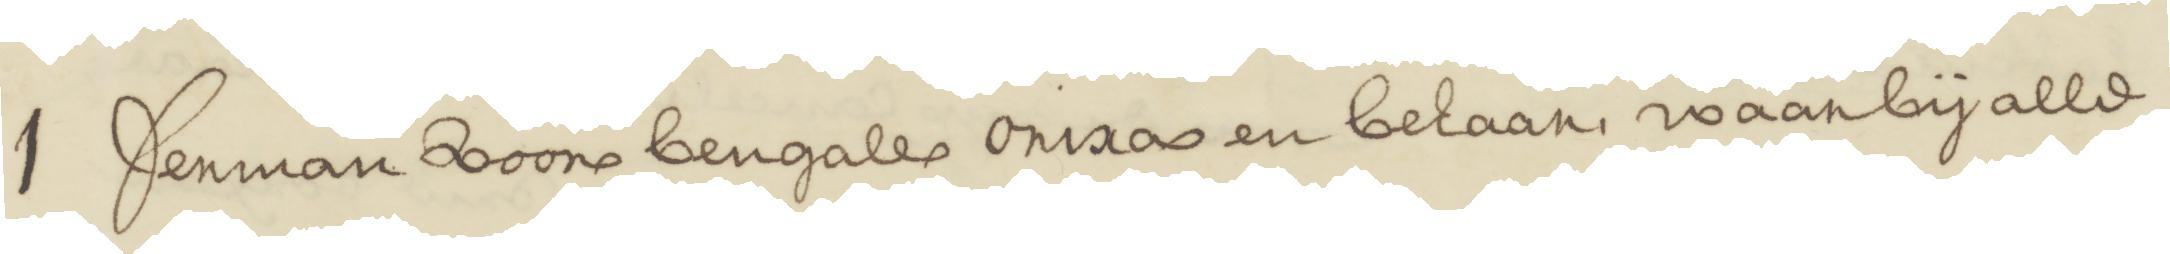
1 ferman voor bengale orixa en behaar, waarbij alle
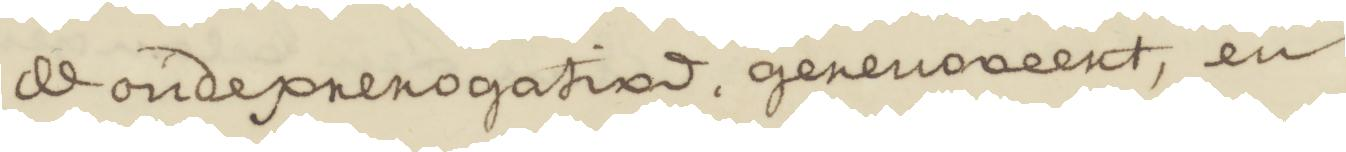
de oudeprerogative, gerenoveert, en
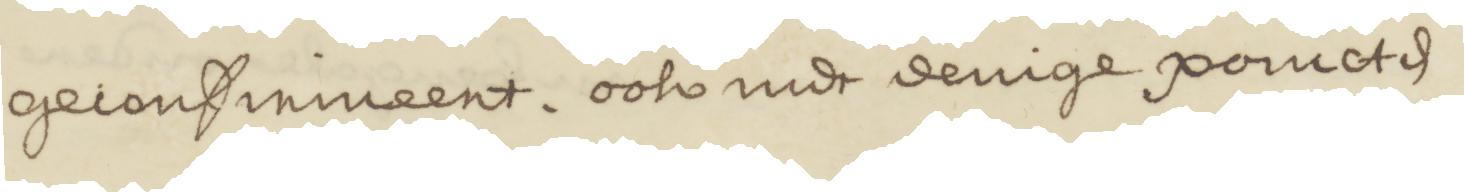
geconfirineert, ook met eenige poincten
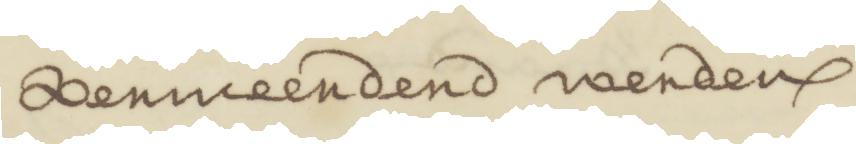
vermeerderd werden
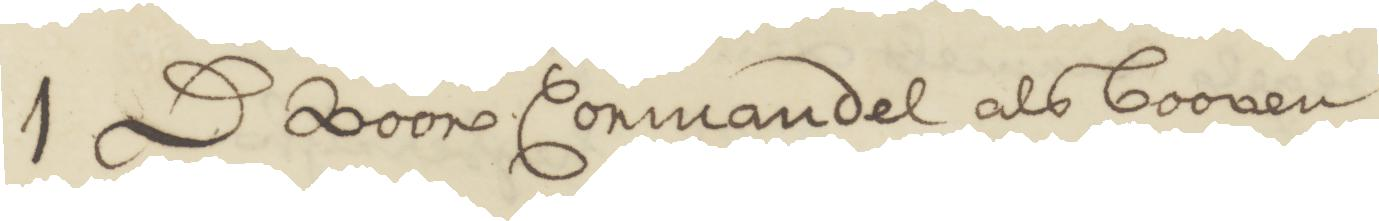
1 D voor Cormandel als booven
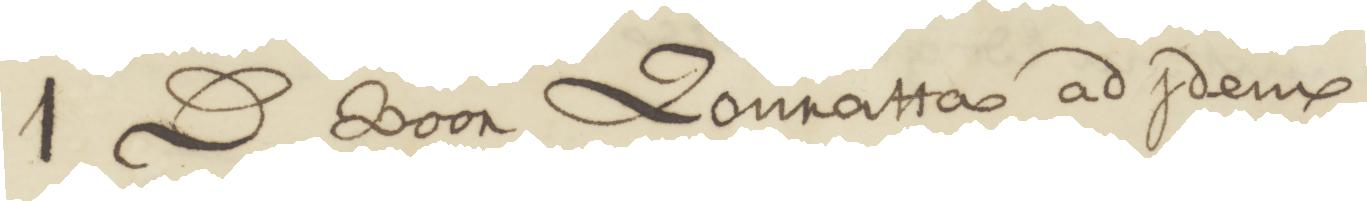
1 D voor Zouratta ad jdem
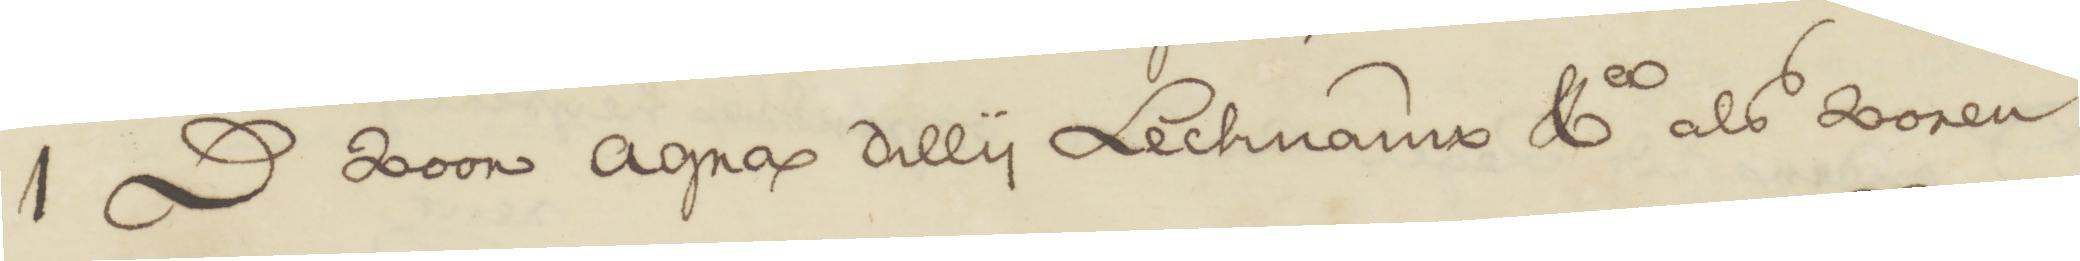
1 D voor Agra dillij Lecknauw &a als voren
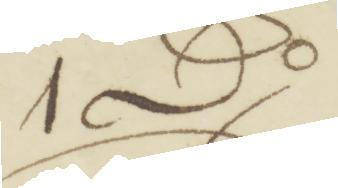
1 Do
